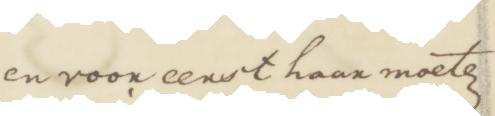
en voor eerst haar moeten
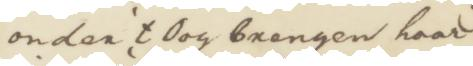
onder ’t Oog brengen haar
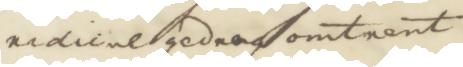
ridicul gedrag omtrent
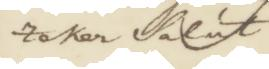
zeker salut.
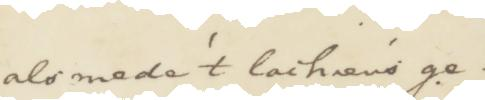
als mede ’t lachieus ge„
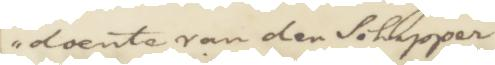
„doente van den schipper
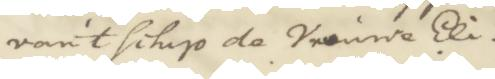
van ’t schip de Vrouwe Eli„
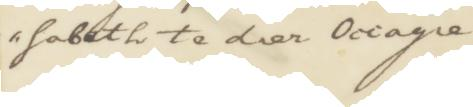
„sabeth te dier Occagie
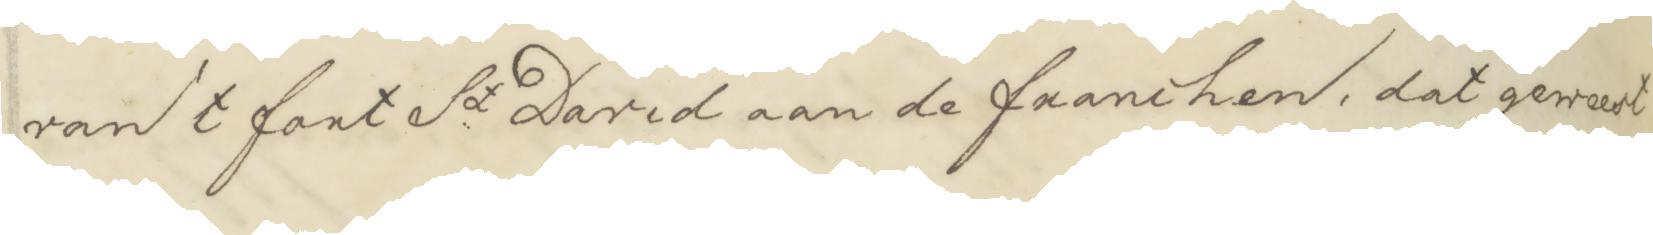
van ’t fort S:t David aan de franchen, dat geweest
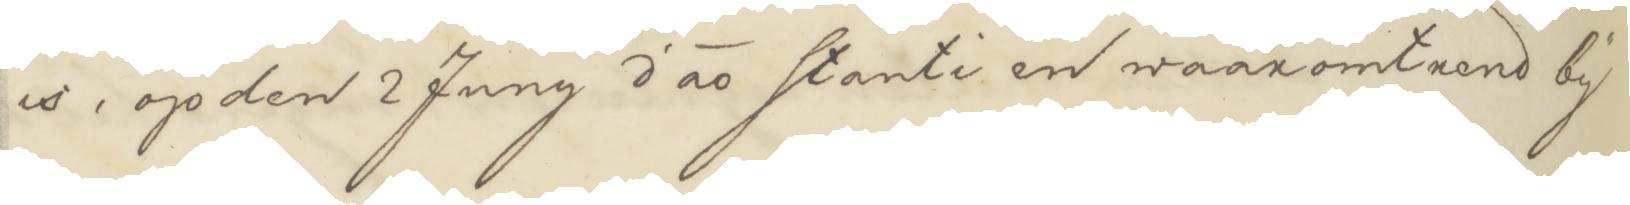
is, op den 2 Junij d' ao stanti en waar omtrend bij
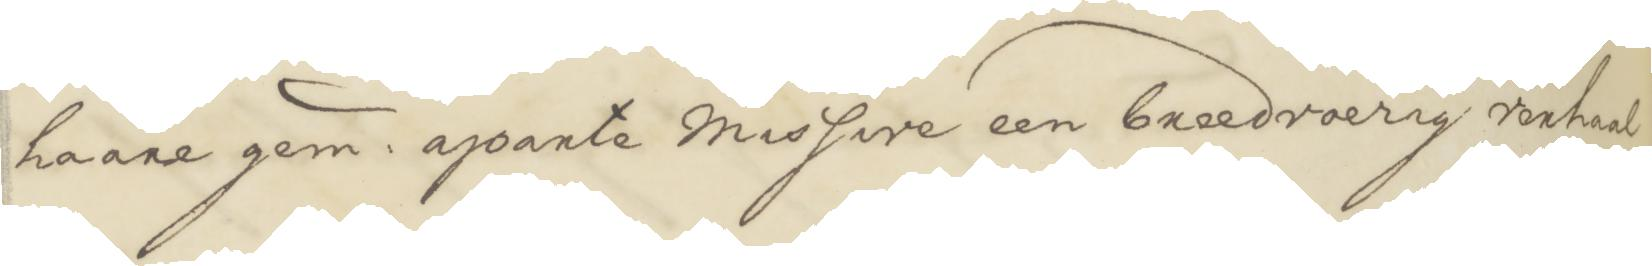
haare gem: aparte missive een breedvoerig verhaal
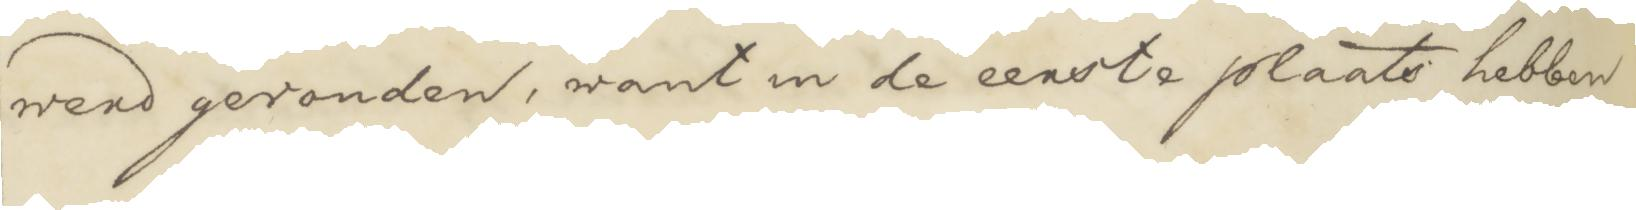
werd gevonden, want in de eerste plaats hebben
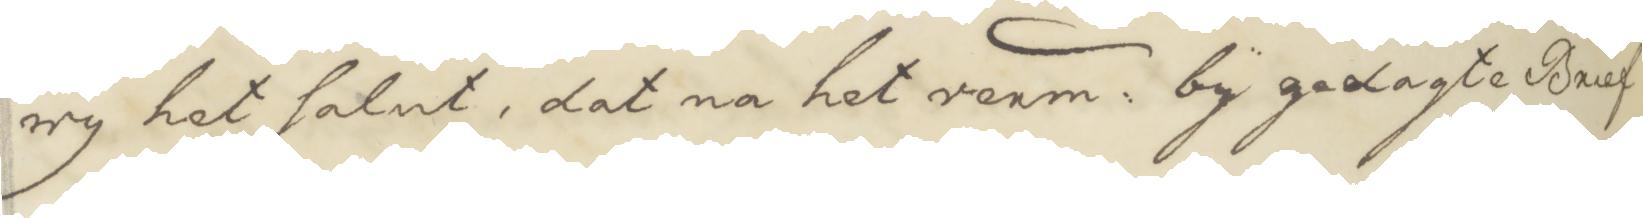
wij het salut, dat na het verm: bij gedagte Brief
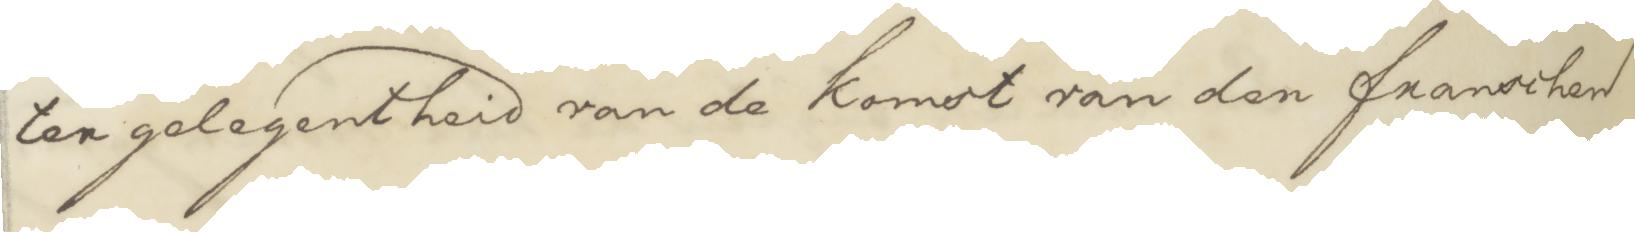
ter gelegentheid van de komst van den franschen
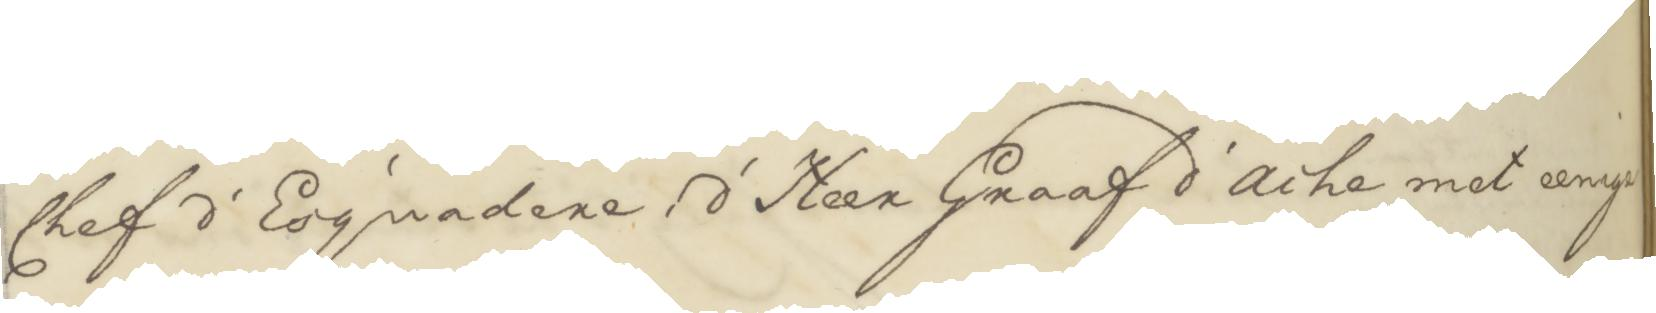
Chef d’ Esquadere d' Heer Graaf d' Ache met eenige
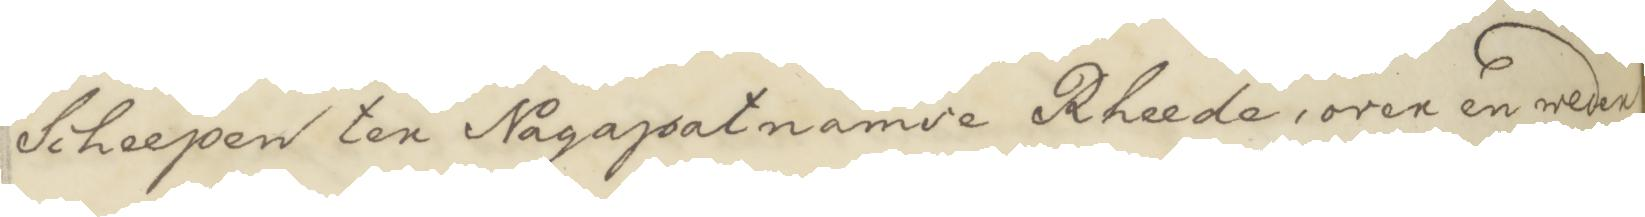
scheepen ter Nagapatnamse Rheede, over en weder
